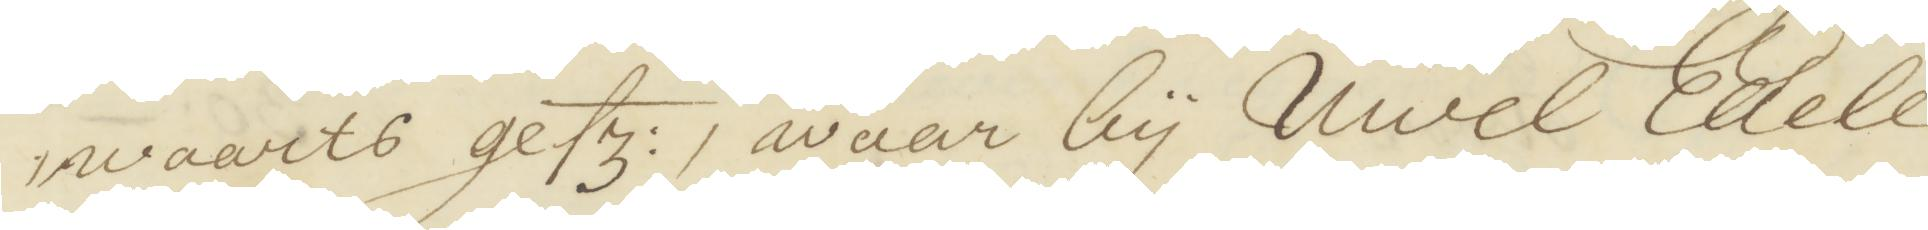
„waarts gesz:, waar bij Uwel Edele
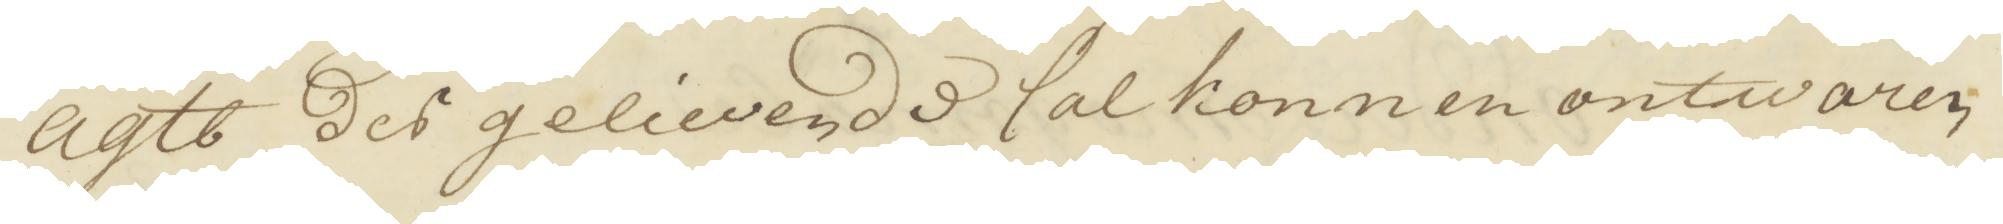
agtb des gelievende sal konnen ontwaren
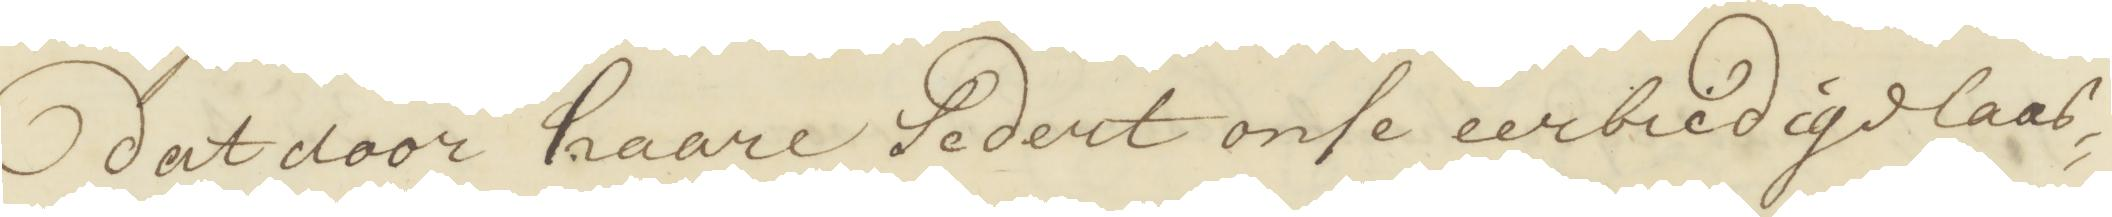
dat door haare sedert onse eerbiedige laas„
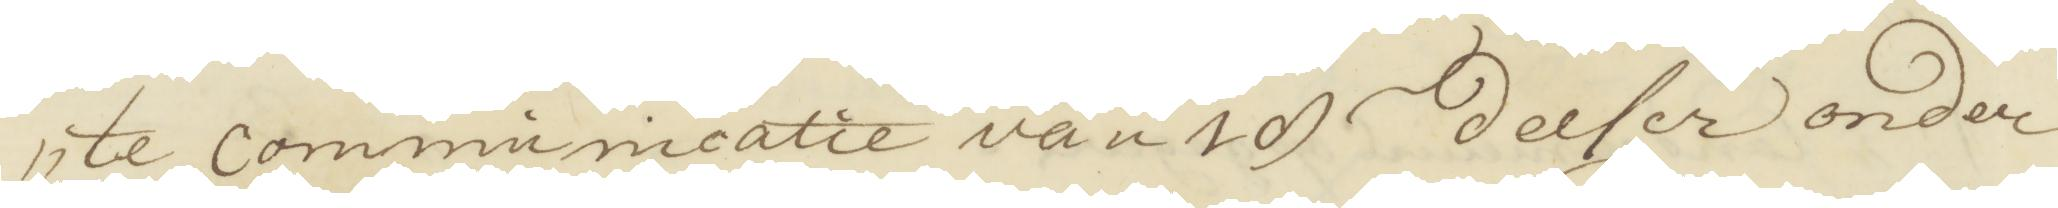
te communicatie van 18' deeser onder
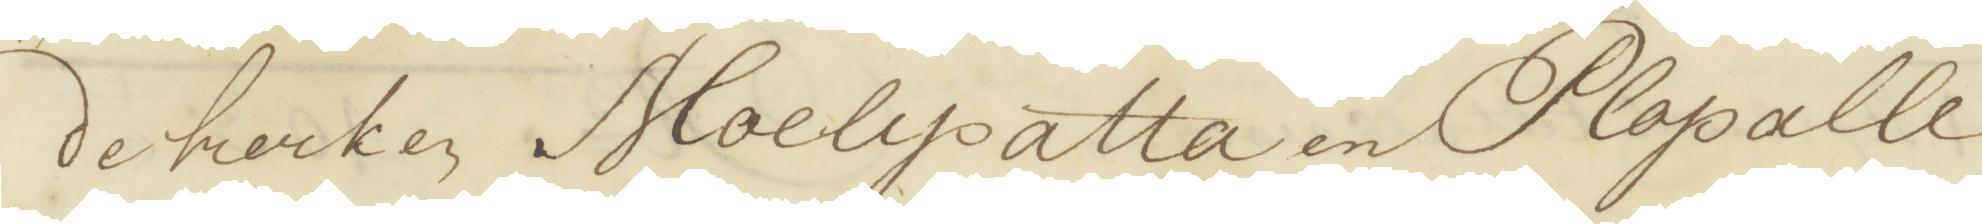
de kerken Moelipatta en Plopalle
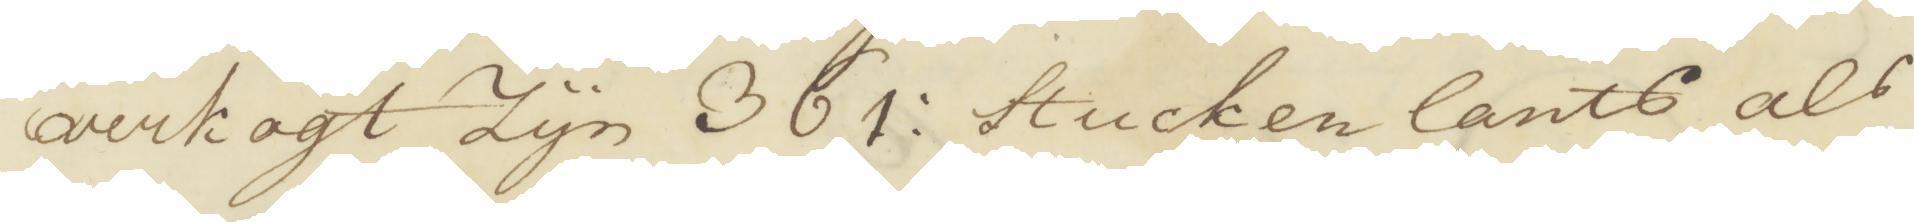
verkogt zijn 361: stucken lants als
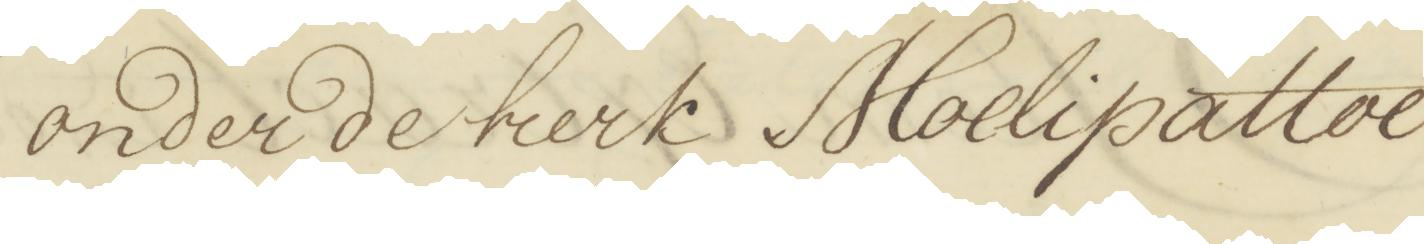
onder de kerk Moelipattoe
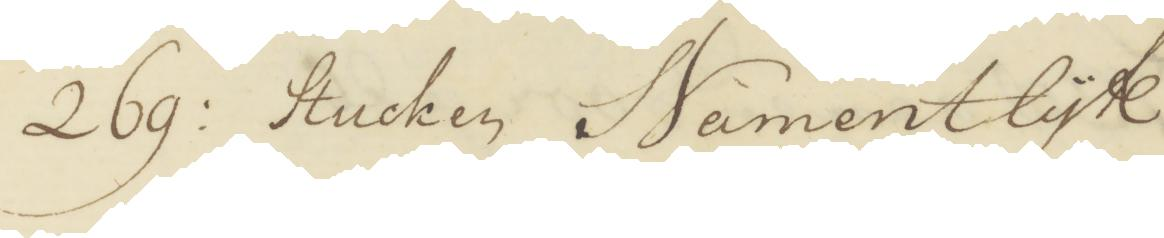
269: stucken Namentlijk
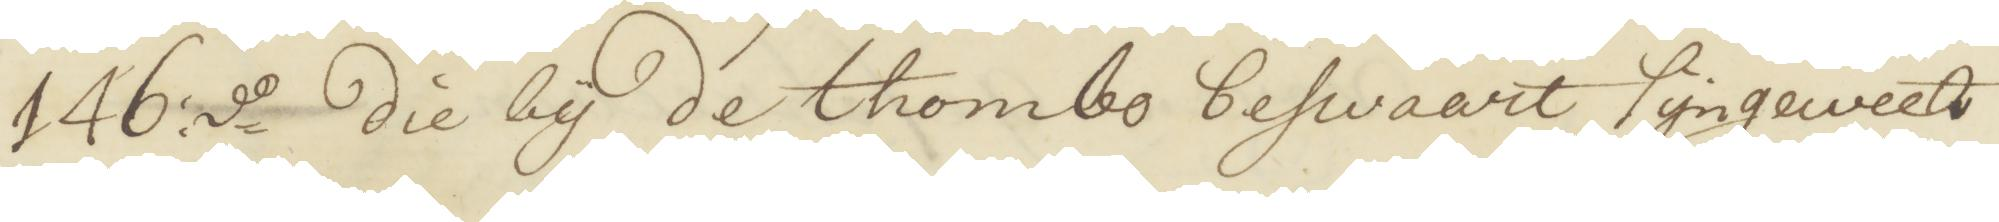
146: d=o die bij de thombo beswaart sijn geweest
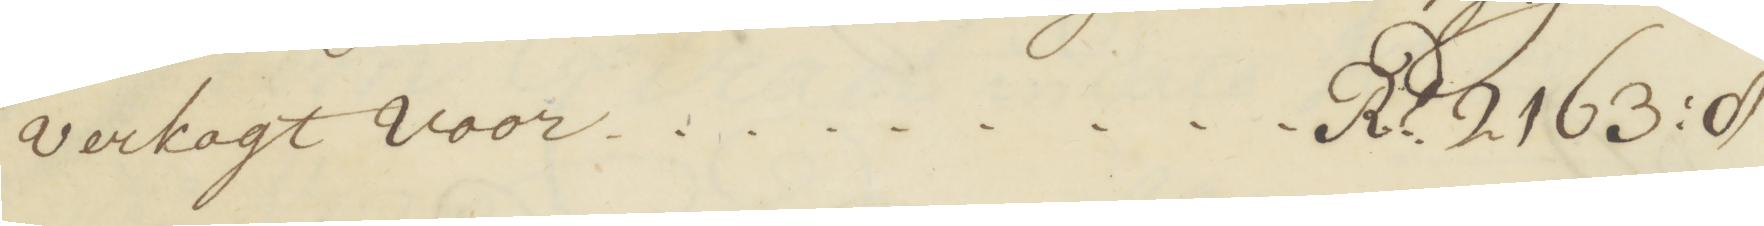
verkogt voor - - - - - - - - - R:d 2163: 8
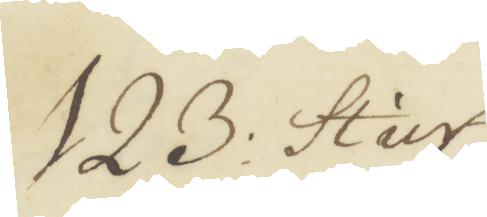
123: stux
